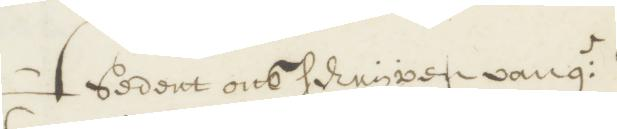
’t sedert ons schrijven van 9:'
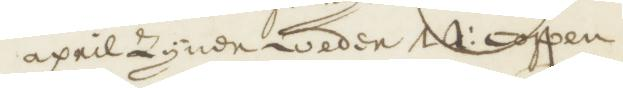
april zijner weder 14: coppen
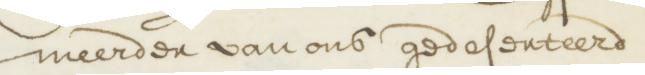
meerder van ons gedeserteerd
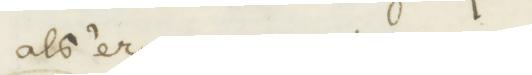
als 'er weer om; en van
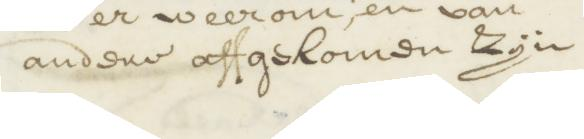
andere afgekomen zijn
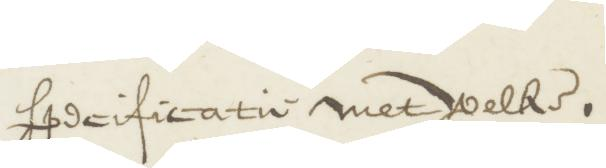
specificatie met welke.
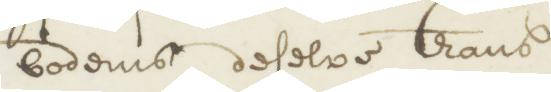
bodems deselve thans
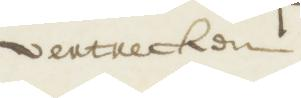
vertrecken
